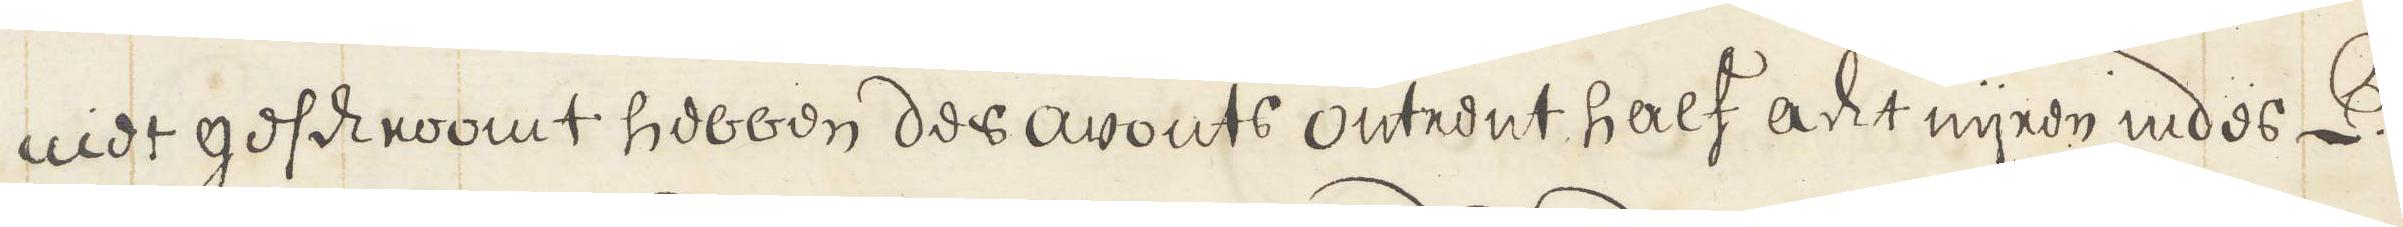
niet geschroomt hebben des avonts ontrent half acht uijren in des E.
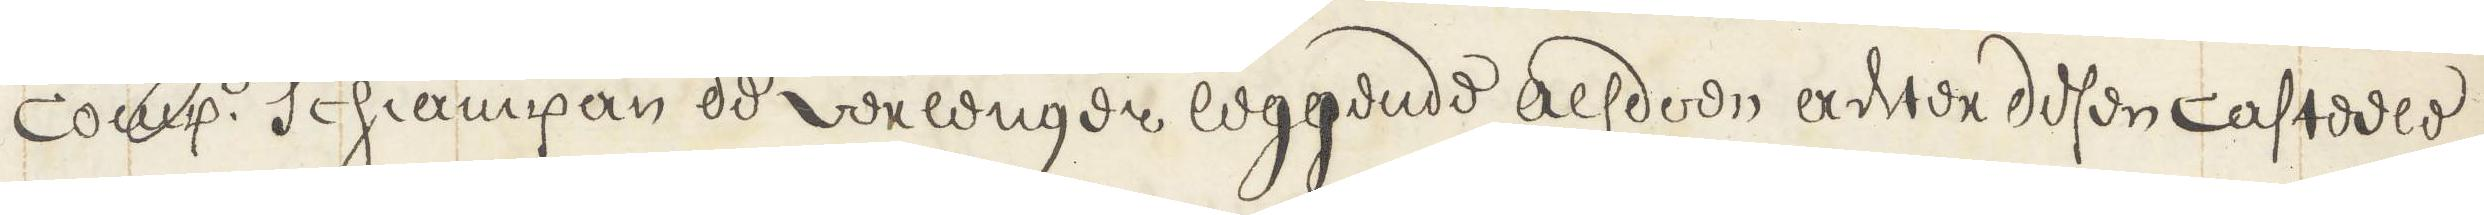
Comp:e schiampan de verlenger leggende alsdoen achter desen casteele
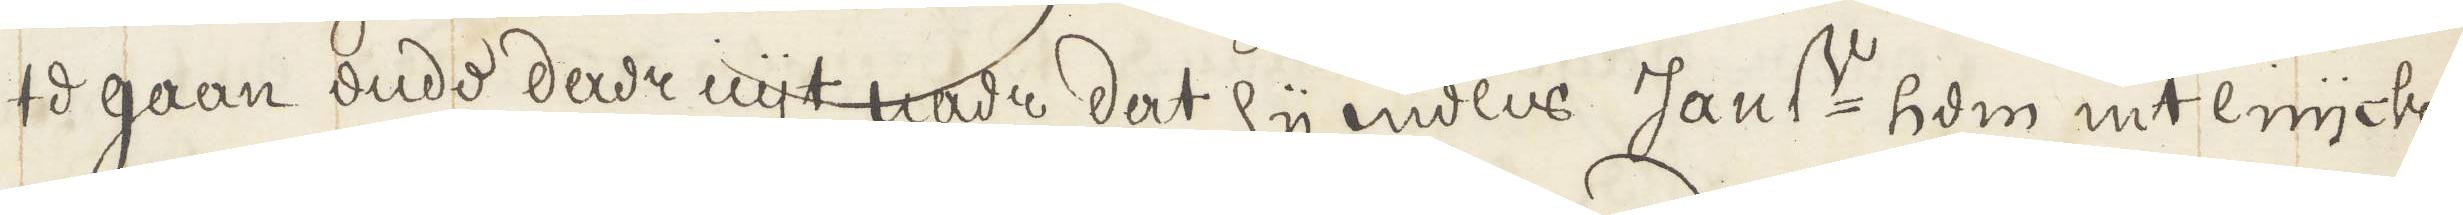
te gaan ende daer uijt naer dat sij melis Jansz hem in't luijck
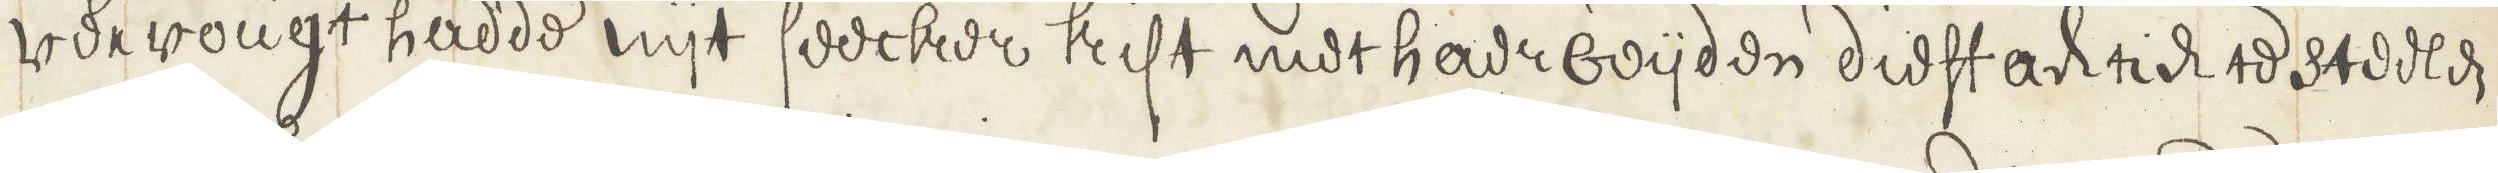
vervougt hadde uijt seecker kist met haer beijden dieffachtich te steelen
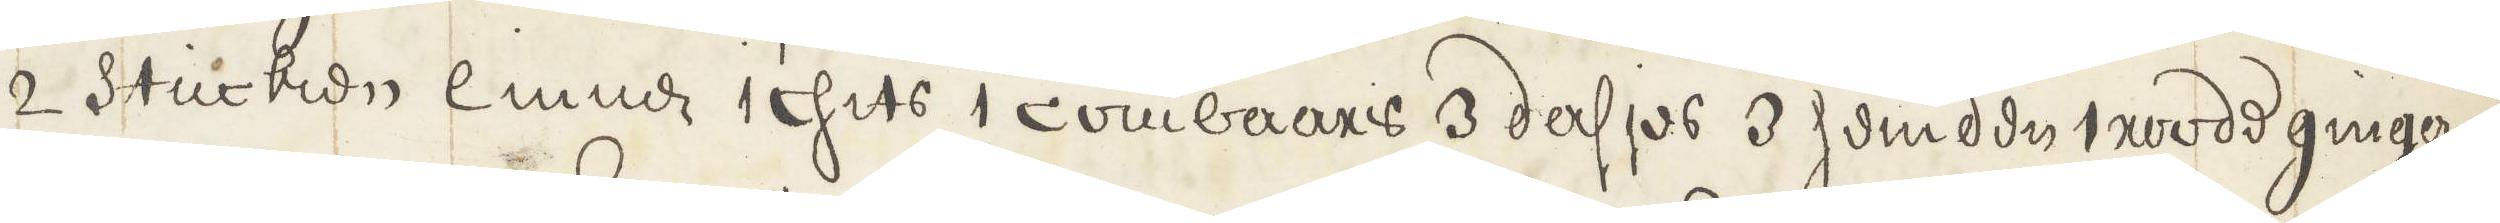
2 stucken linnen 1 chits 1 combaars 3 dasjes 3 hemden 1 roode gingan
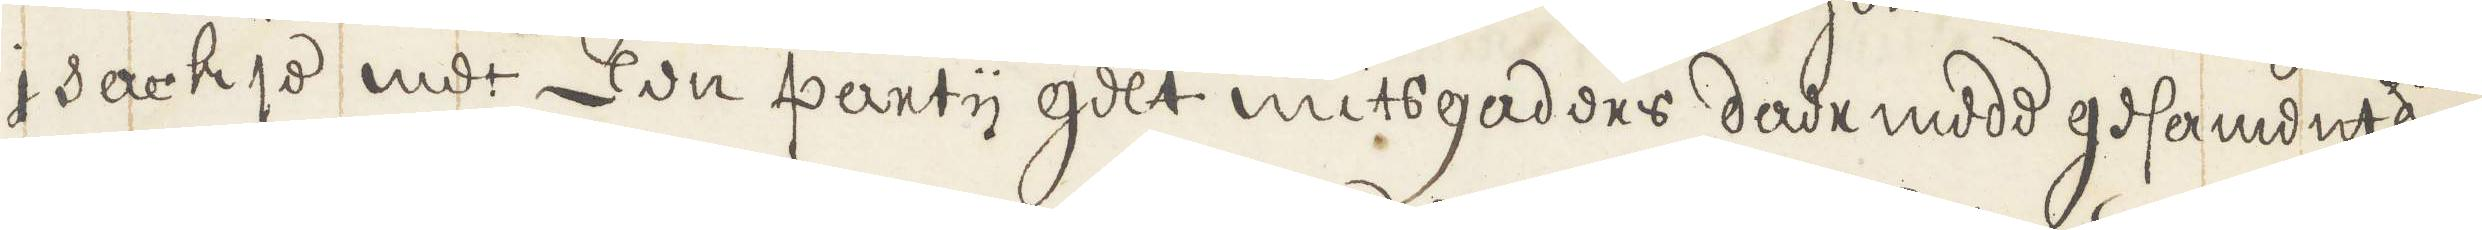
j sackje met Een partij gelt mitsgaders daer mede gesamentlijk
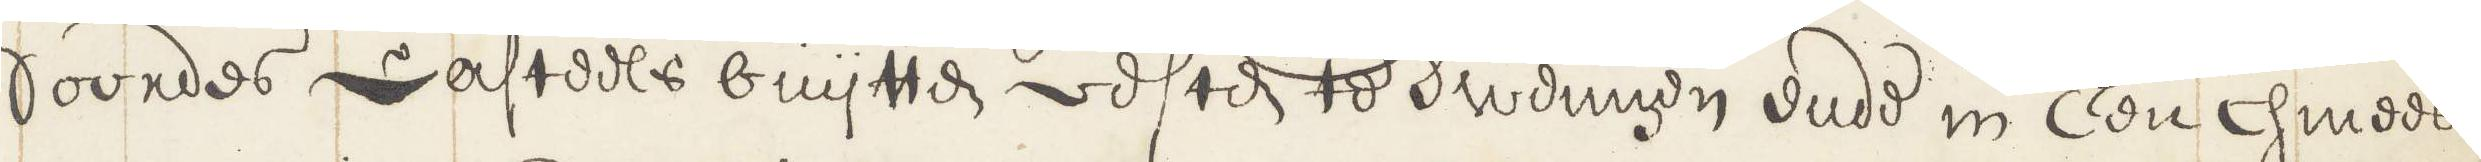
doordes Casteels buijtten vesten te swemmen ende in Een chinees
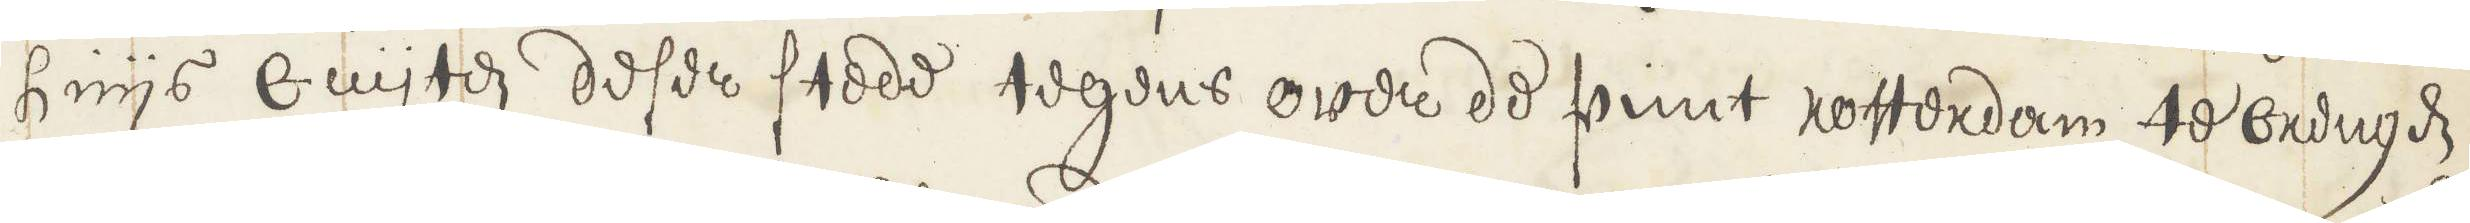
huijs buijten deser stede tegens over de punt rotterdam te brengen
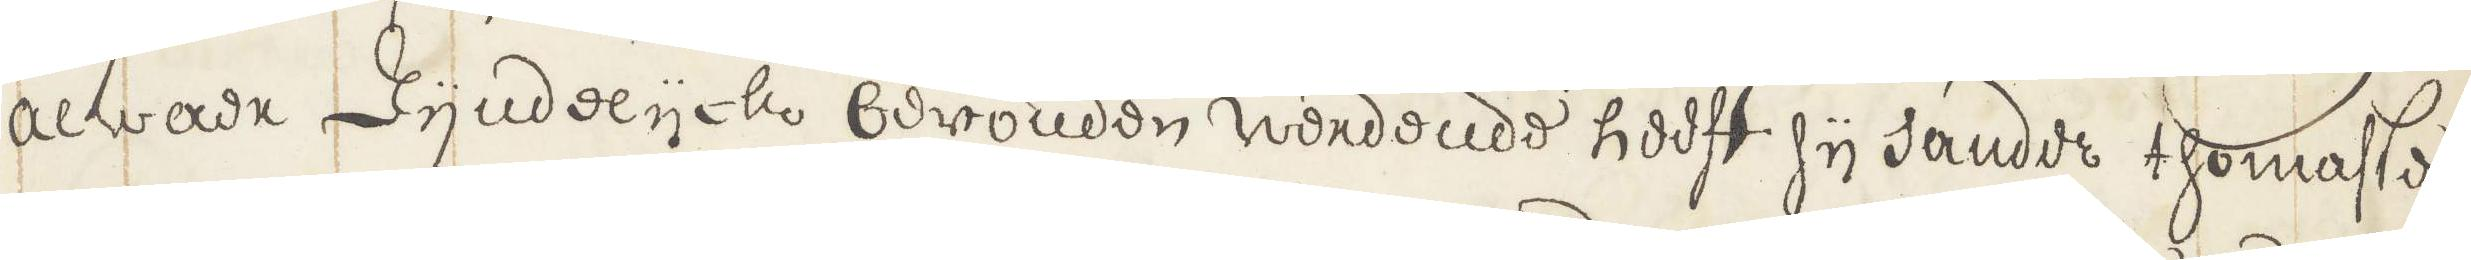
alwaer Eijndelijck bevonden werdende heeft hij sander thomasse
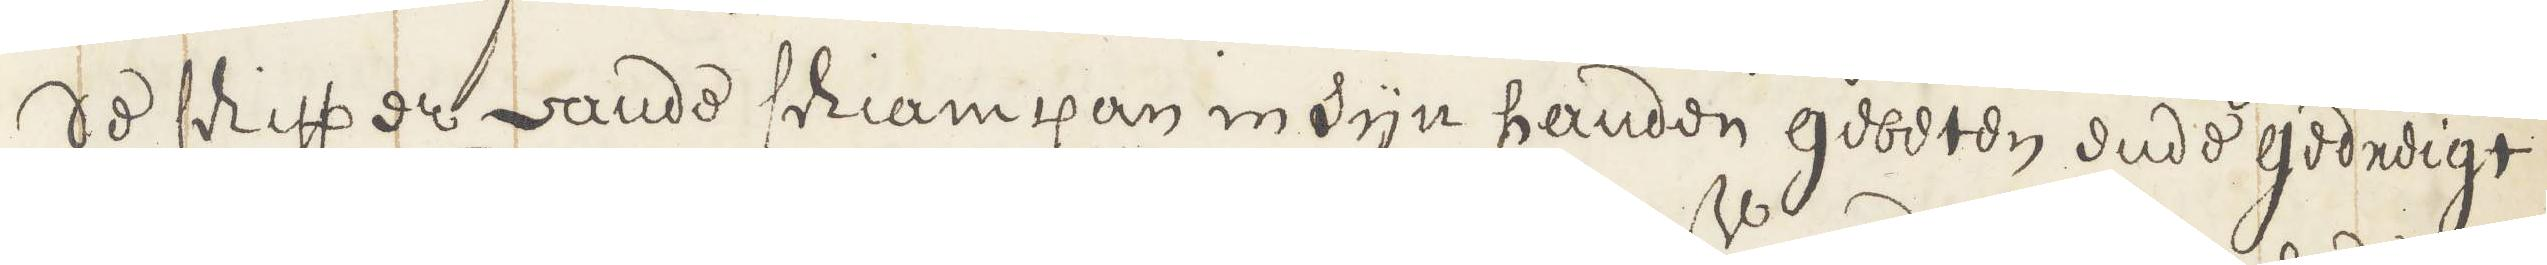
de schipper vande schiampan in sijn handen gebeten ende gedreigt
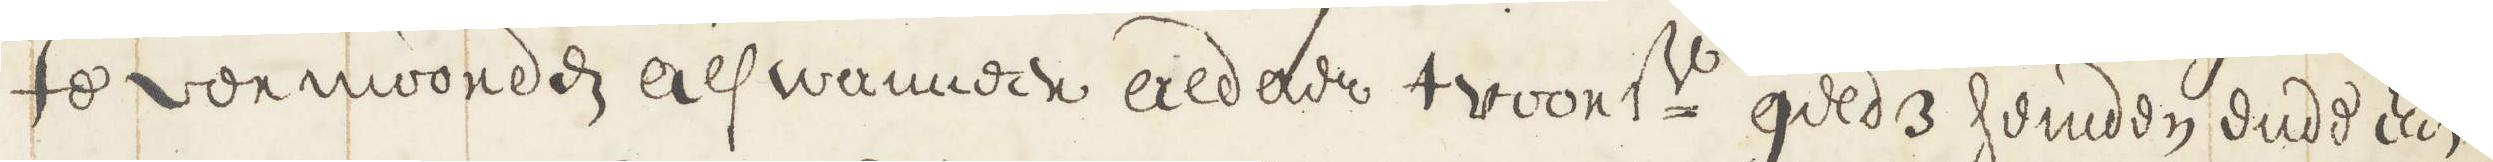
te vermoorden als wanneer aldaer t voors=z geld 3 hemden ende een
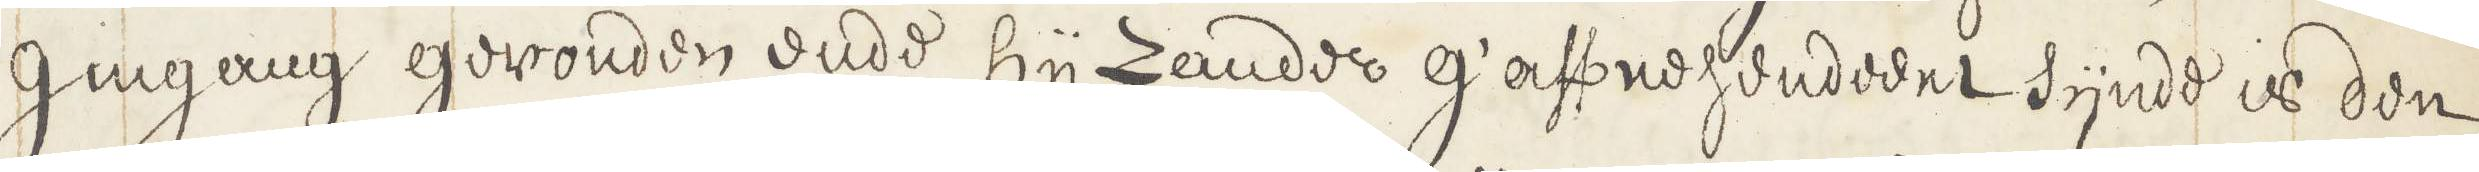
gingang gevonden ende hij zonder g’apprehendeert sijnde is den
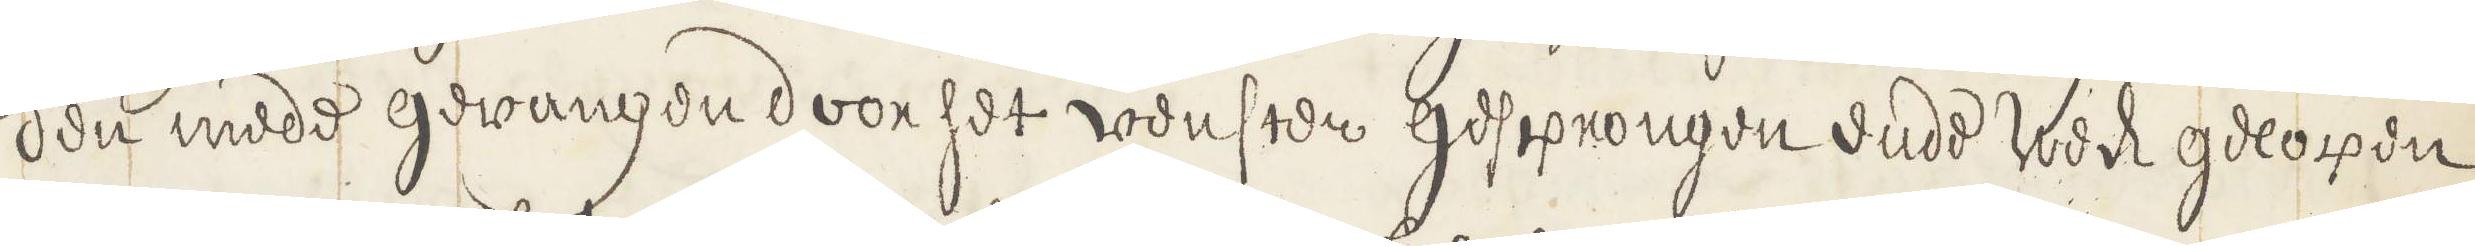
den mede gevangen door het venster gesprongen ende wech gelopen
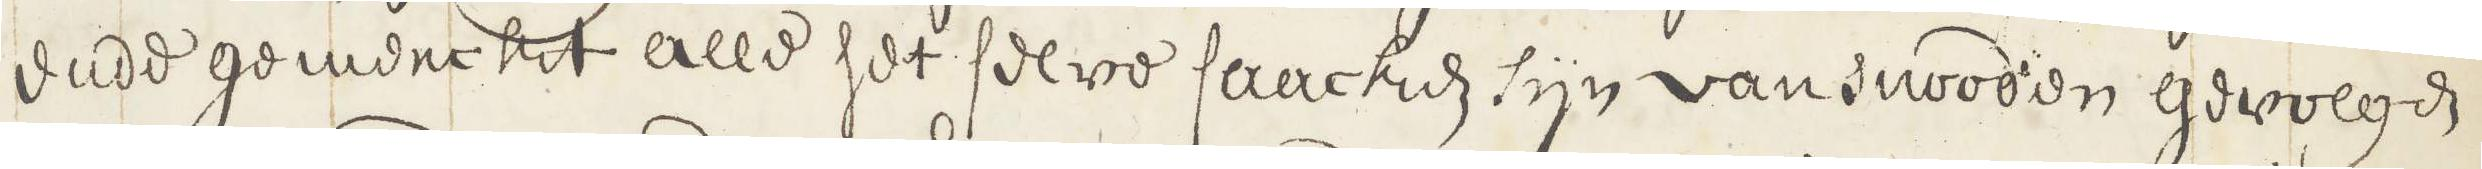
ende gemerckt alle het selve saacken sijn van snooden gevolgen
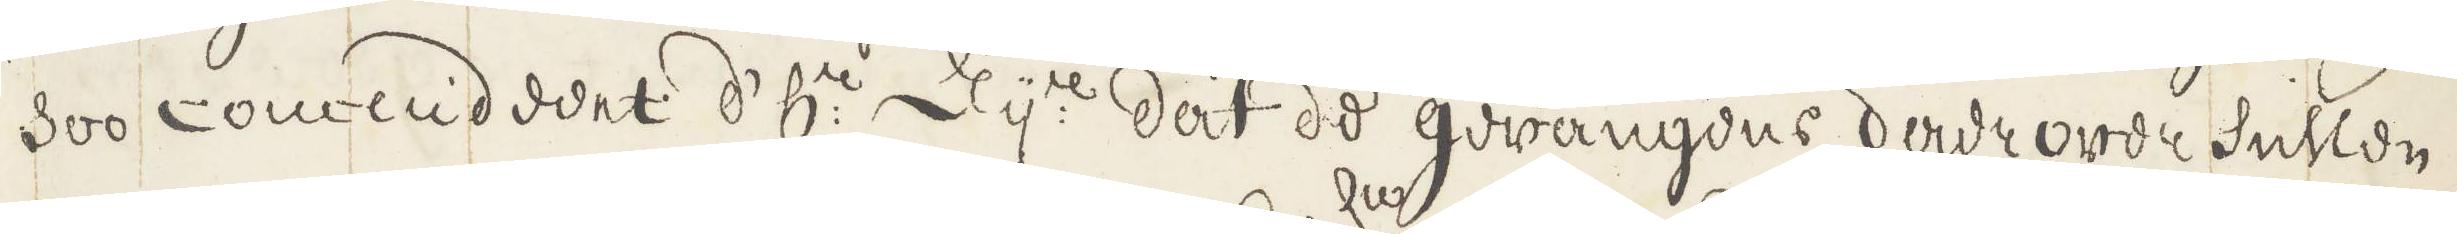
soo concludeert d’ h:r Eij:r dat de gevangens daer over sullen
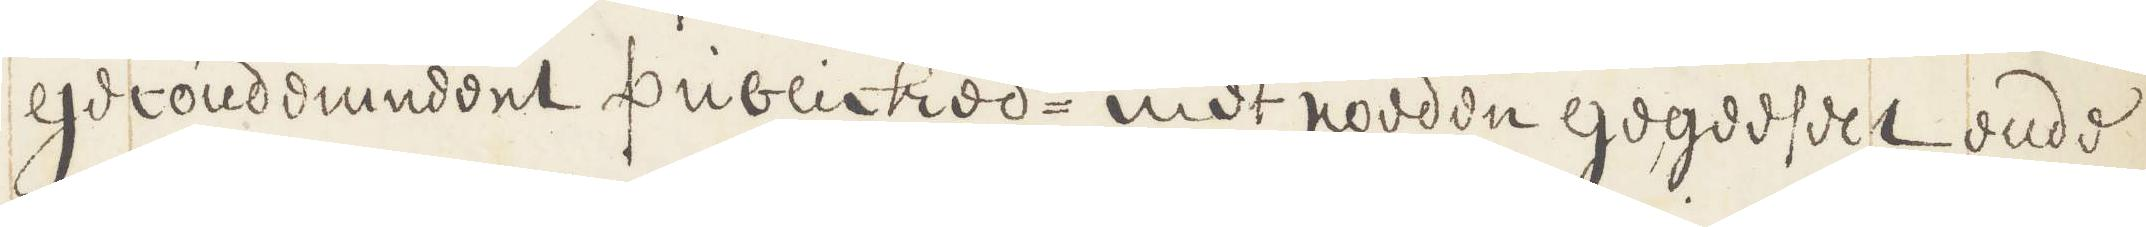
gecondemneert publickelijk met roeden gegeefelt ende
